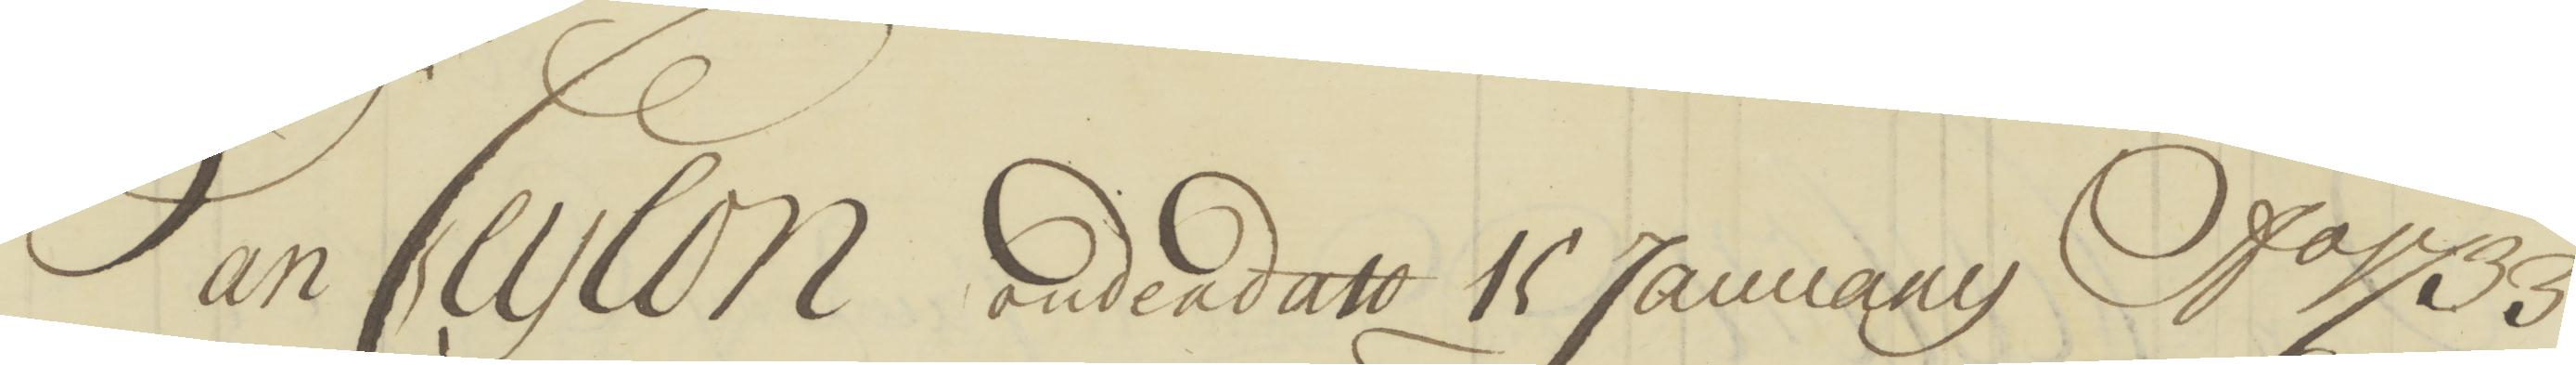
Van Ceylon onder dato 15 January A:o 1733
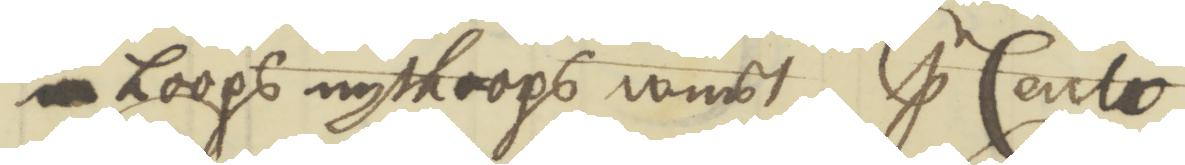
inkoops uytkoops winst p: r Cento
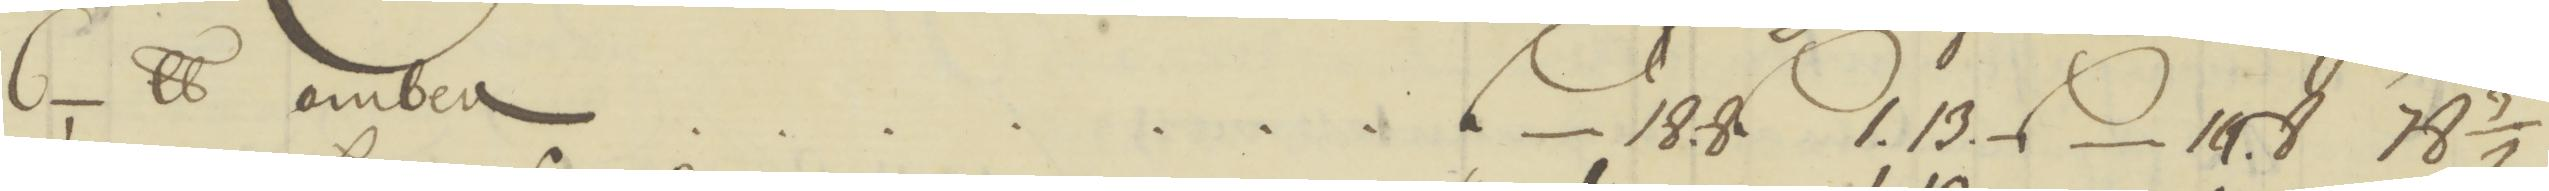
6— lb amber . . . . . . . ƒ— 18:8ƒ 1.13.—ƒ — 14.8 78 3/8
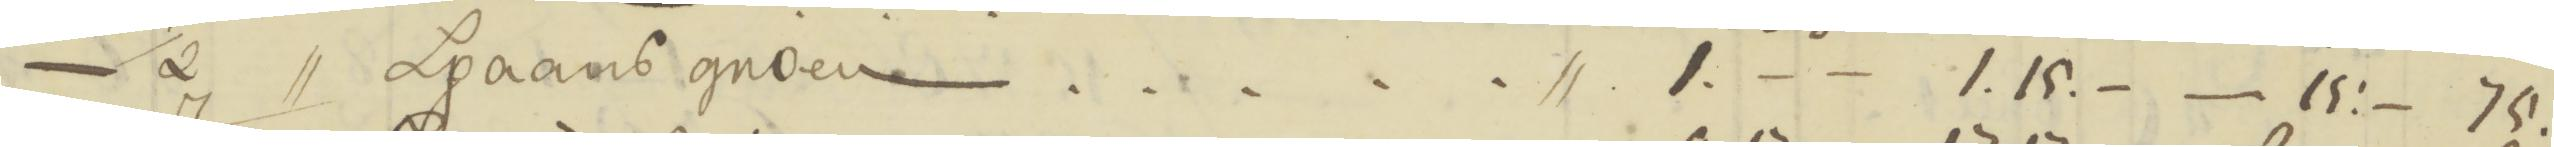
— ½ „ Spaans groen . . . . . „ . 1.— — 1.15.— — 15:— 75.
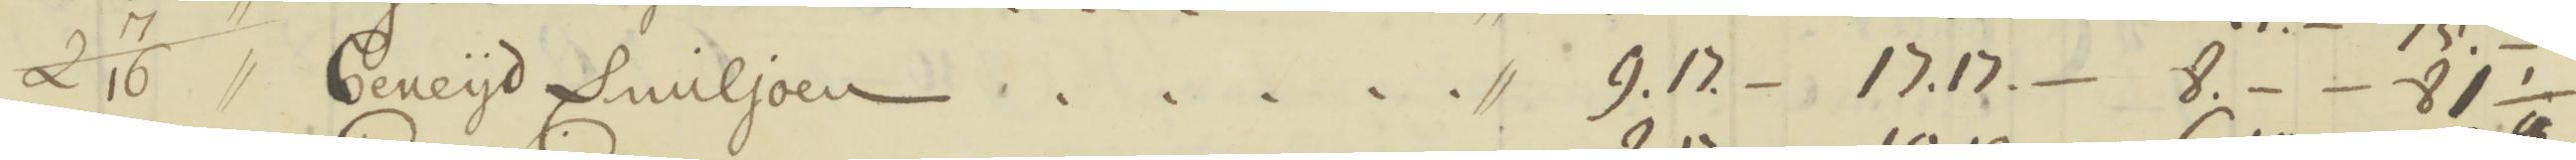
2 7/16 „ bereijd vermiljoen . . . . . „ 9.17.— 17.17.— 8.— — 81¼
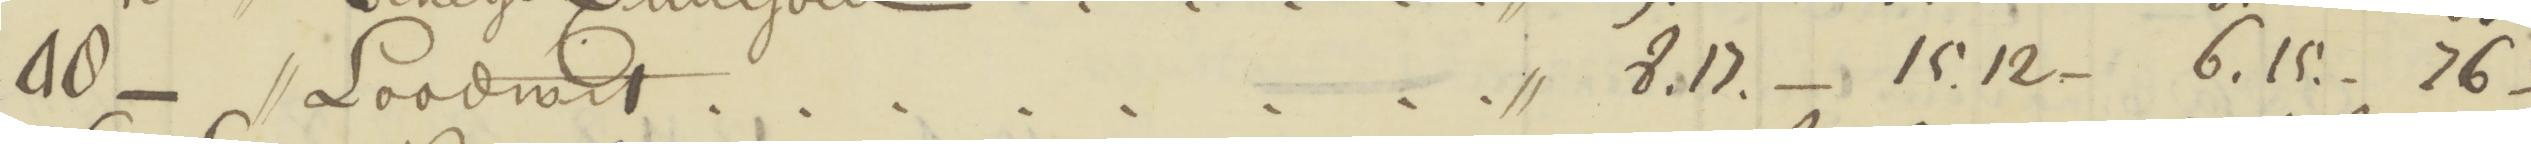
48— Loodwit . . . . . . . . „ 8.17.— 15.12- 6.15.- 76¼
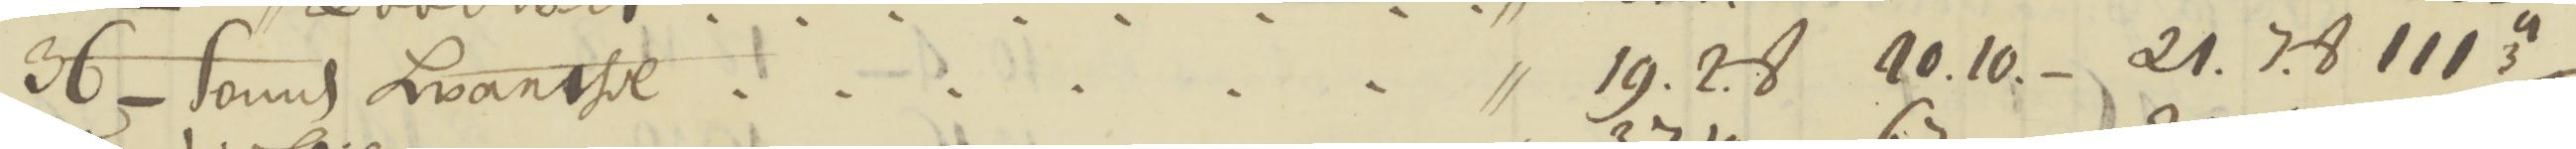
36 –tonnen Swartsel . . . . . . „ 19.2.8 40.10.— 21.7.8 111¾
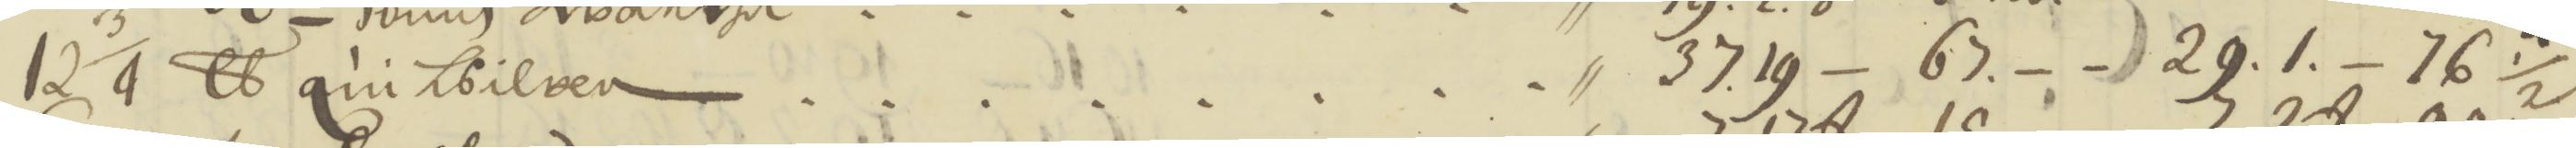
12¾ lb quiksilver . . . . . . . . „ 37.19 — 67.—. - 29.1.- 76½
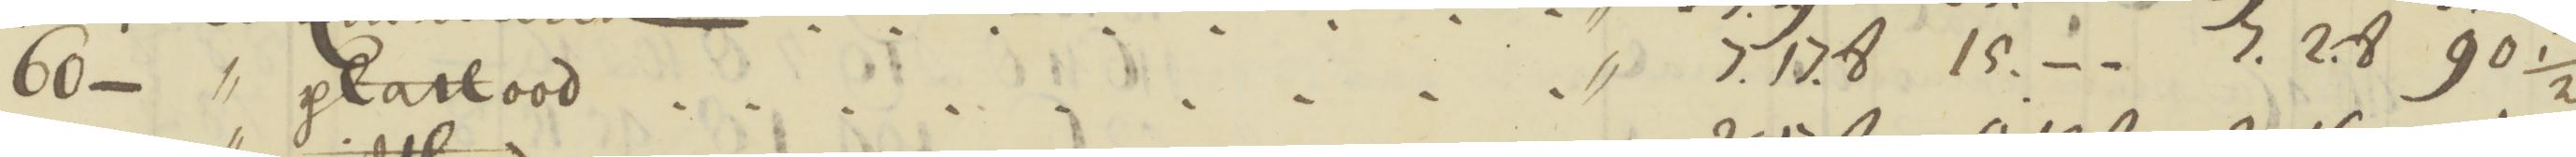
60— „ platlood . . . . . . . . . „ 7. 17.8 15.— - 7.2.8 90½:
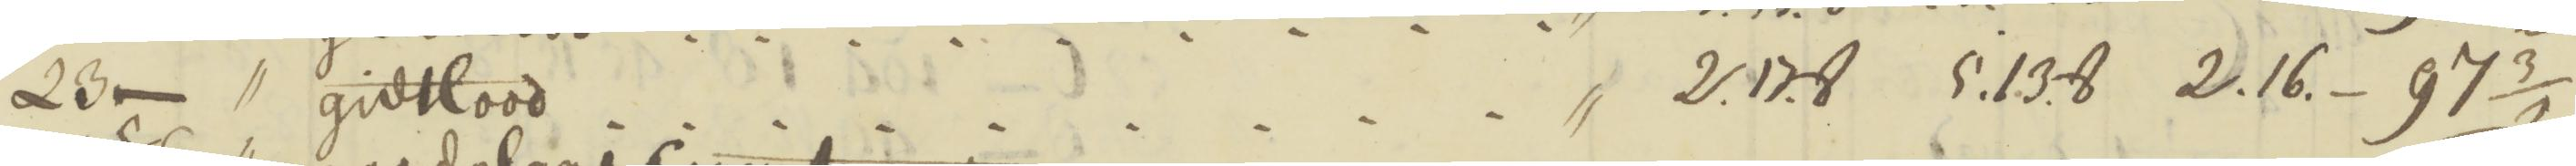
23—„ gietlood . . . . . . . . . „ 2: 17.8 5.13.8 2.16.- 97 3/8.
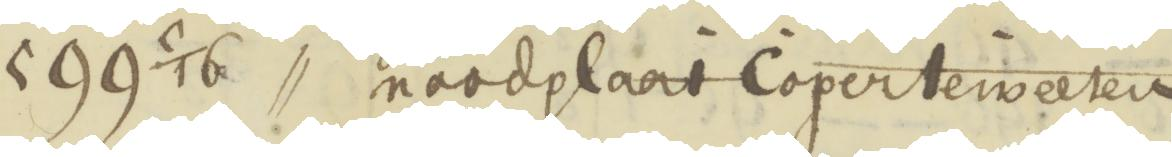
599 5/16 „ roodplaat Coper teweeten
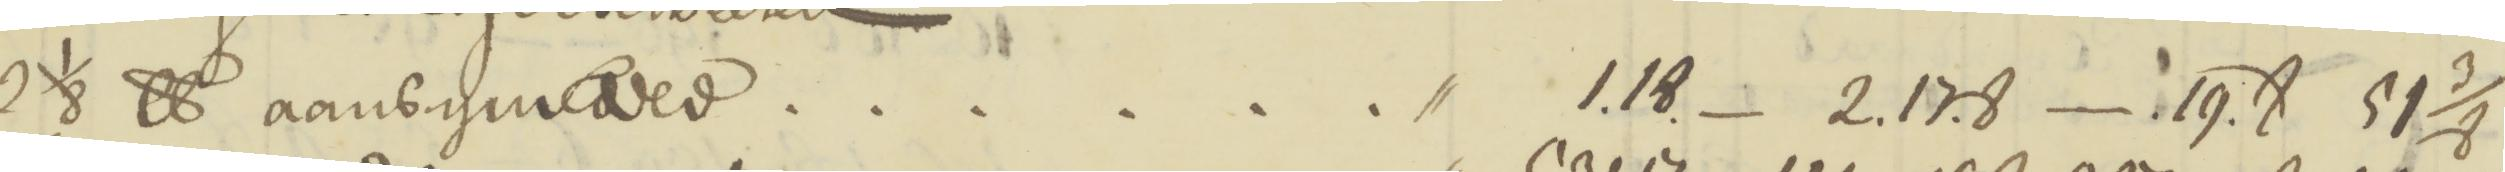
2 1/8 lb aansyn Edele . . . . . . „ 1.18.— 2.17:8 — :19.8 51 3/8
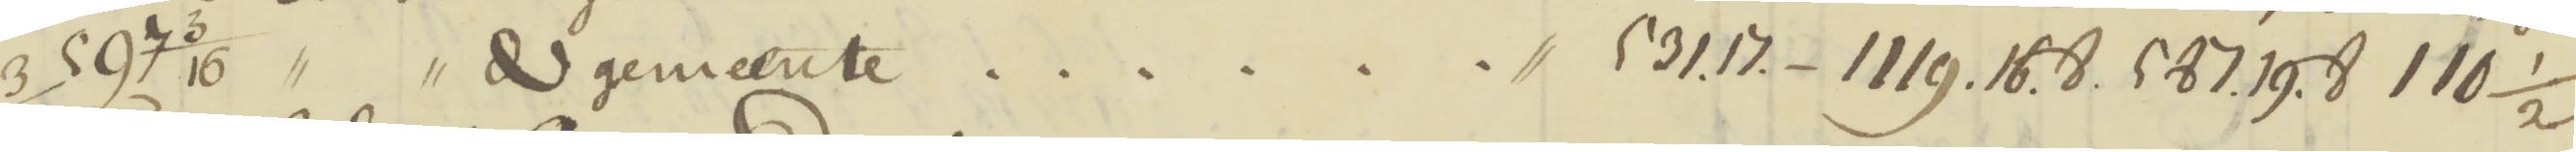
597 3/16 „ „ de gemeente . . . . . . „ 531.17:— 1119. 16.8. 587.19.8 110½
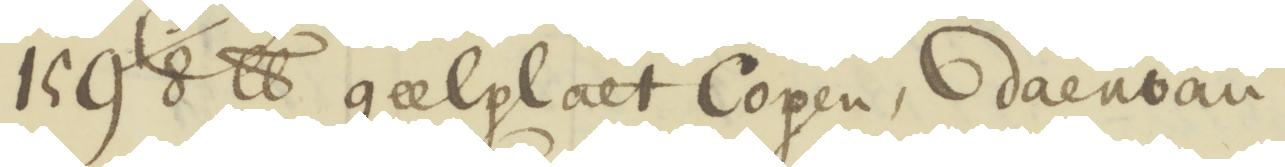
159 3/8 lb geelplaet Coper, daervan
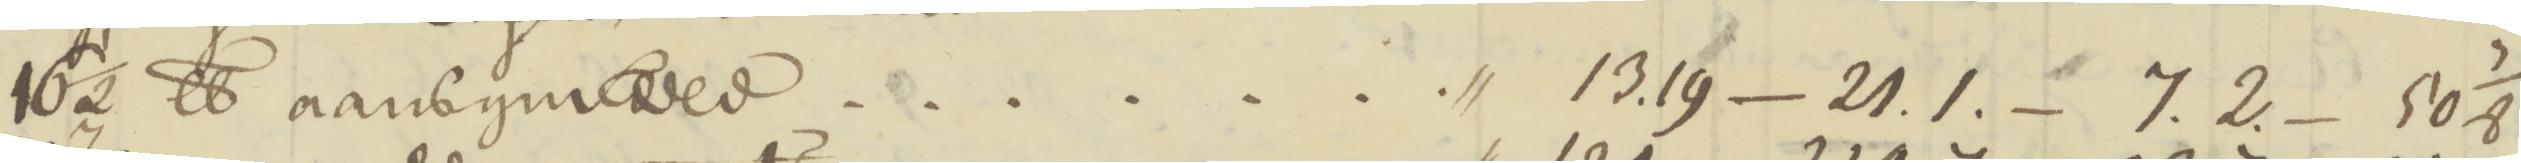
16½ lb aan syn Edele . . . . . . . „ 13.19 — 21.1.— 7.2.- 50 3/8
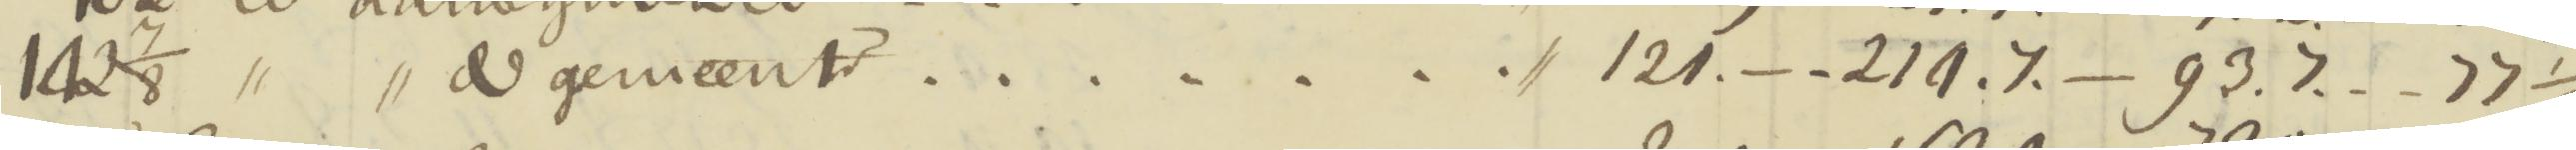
142 7/8 „ „ de gemeente. . . . . . . „ 121.— -214.7. 93.7.- -77 1/8
